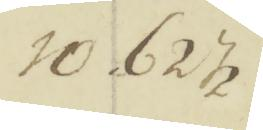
10„62½
